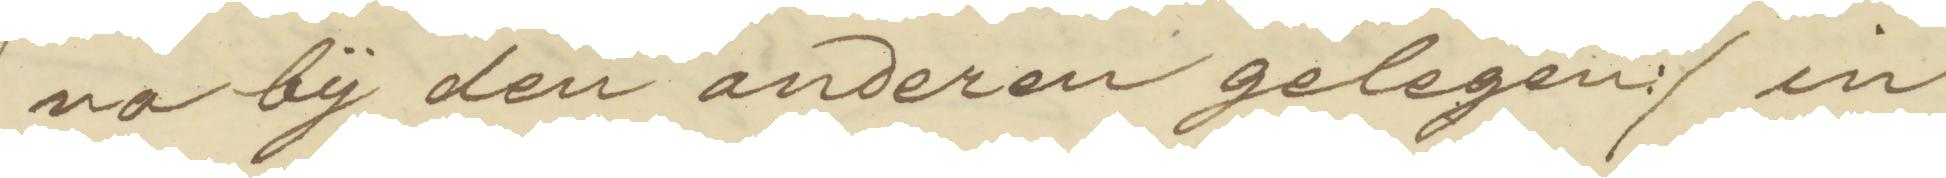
na bij den anderen gelegen:/ in
